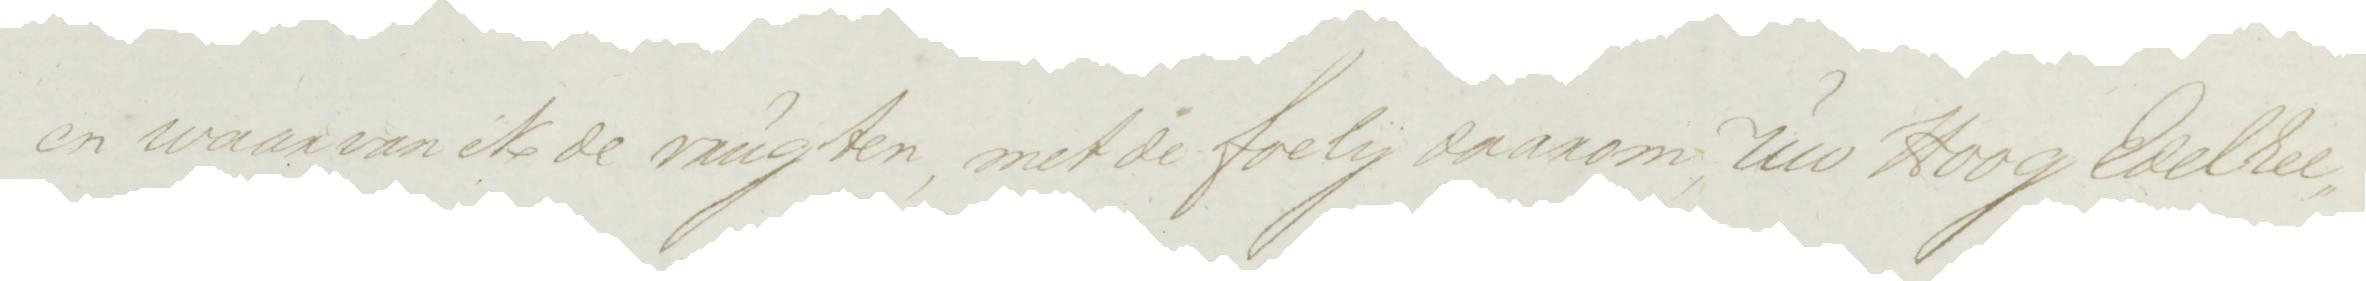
en waar van ik de vrugten, met de foelij daarom, uw Hoog Edelhee„
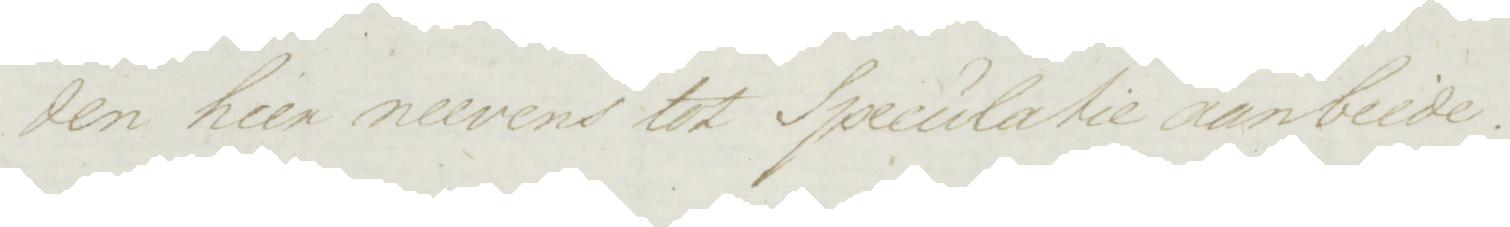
den hier neevens tot speculatie aanbiede
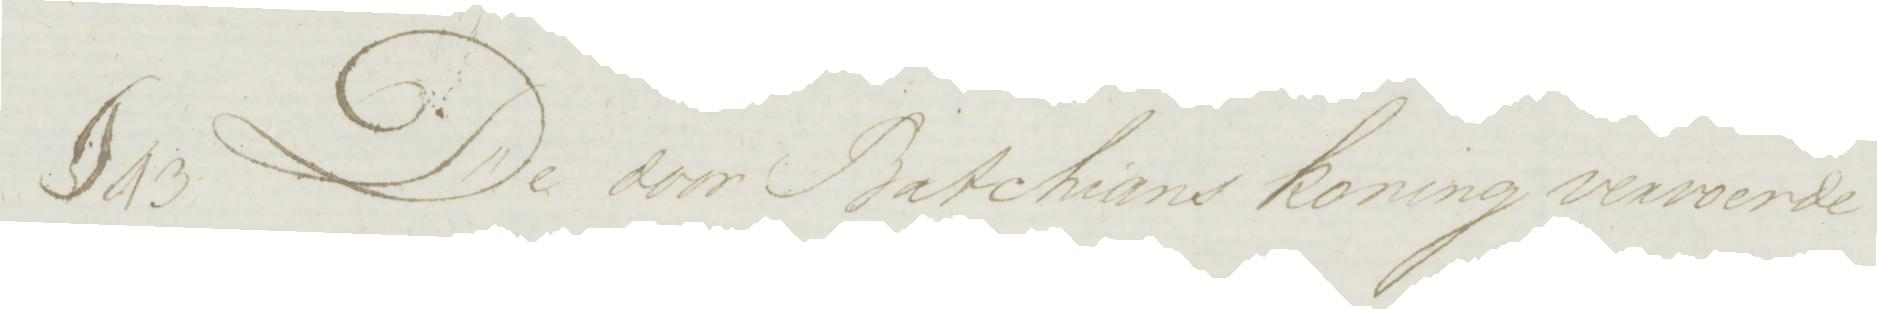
§43 De door Batchians koning vervoerde
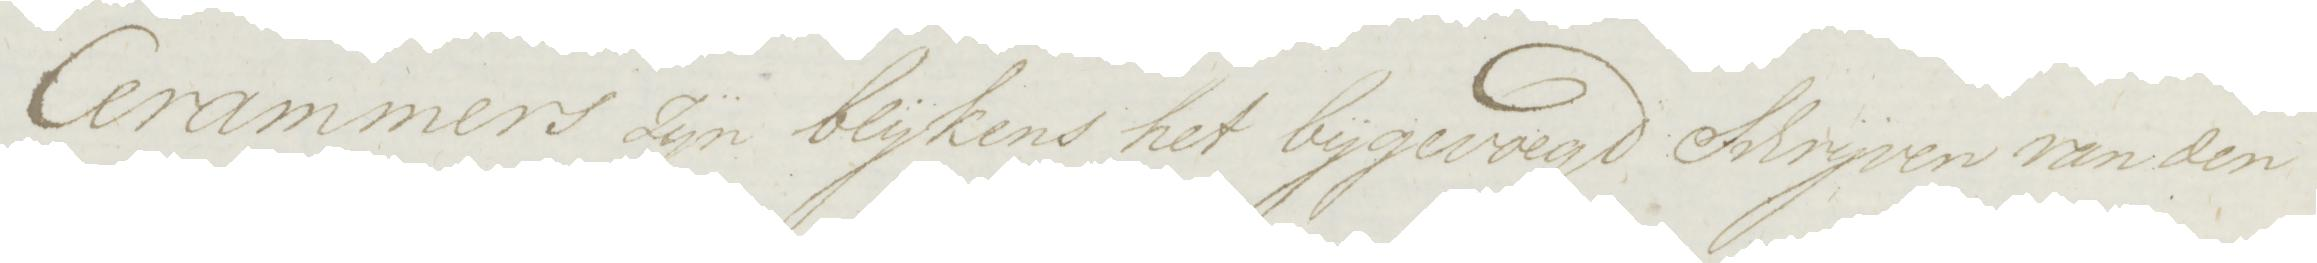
Cerammers zijn blijkens het bijgevoegd schrijven van den
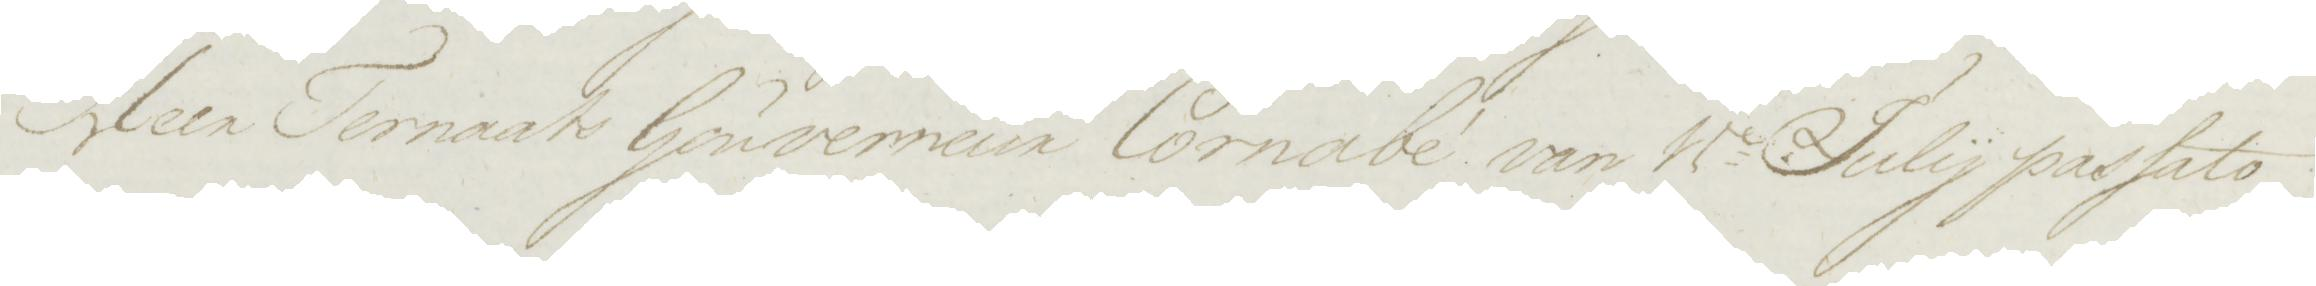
Heer Ternaats Gouverneur Cornabé van 15=e Iulij passato
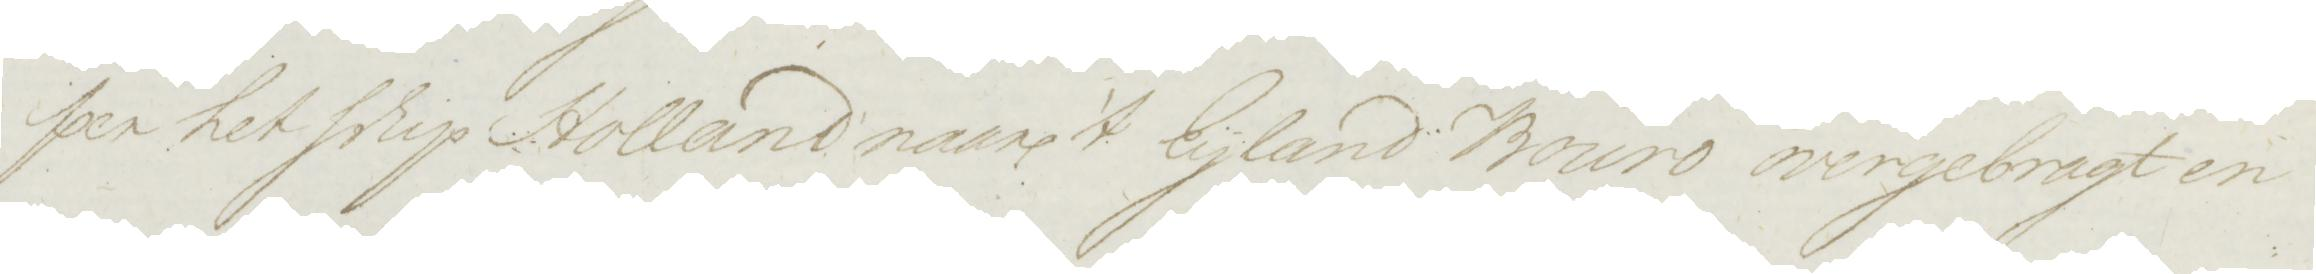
per het schip Holland naar 't Eijland Bouro overgebragt en
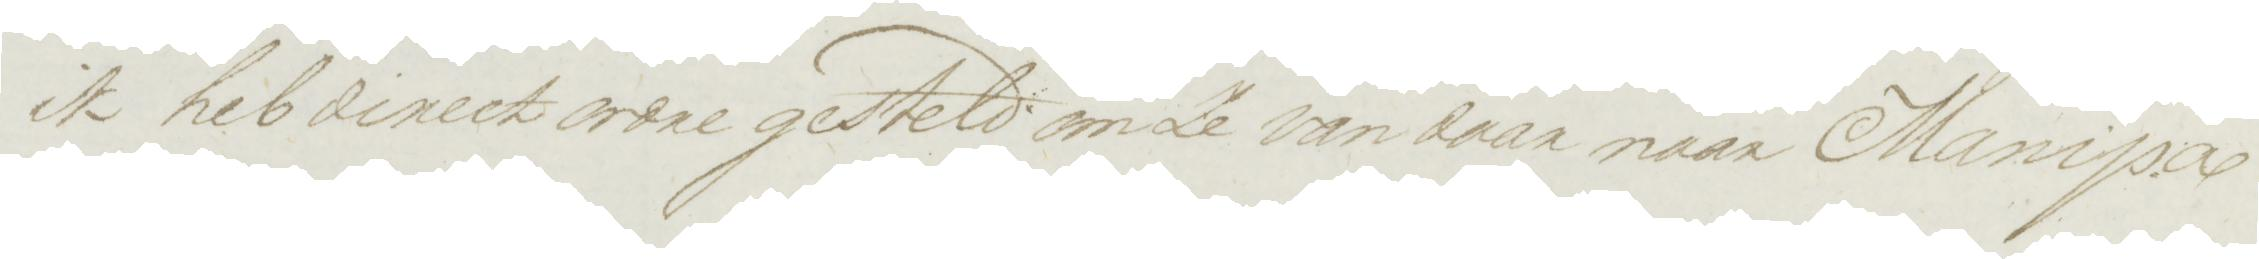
ik heb direct ordre gesteld om ze van daar naar Manipa
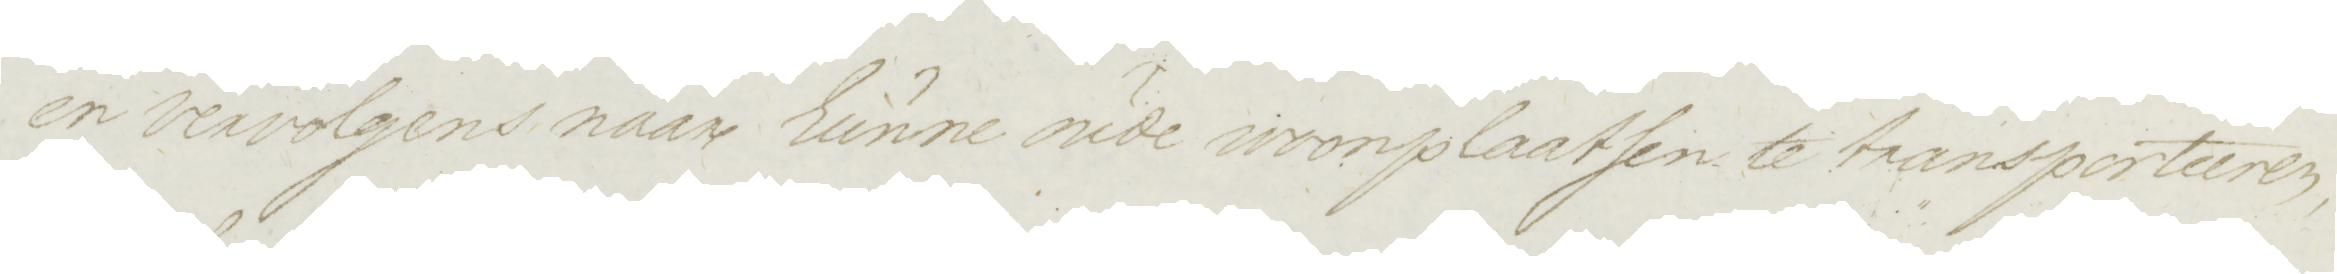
en vervolgens naar hunne oude woonplaatsen te transporteeren
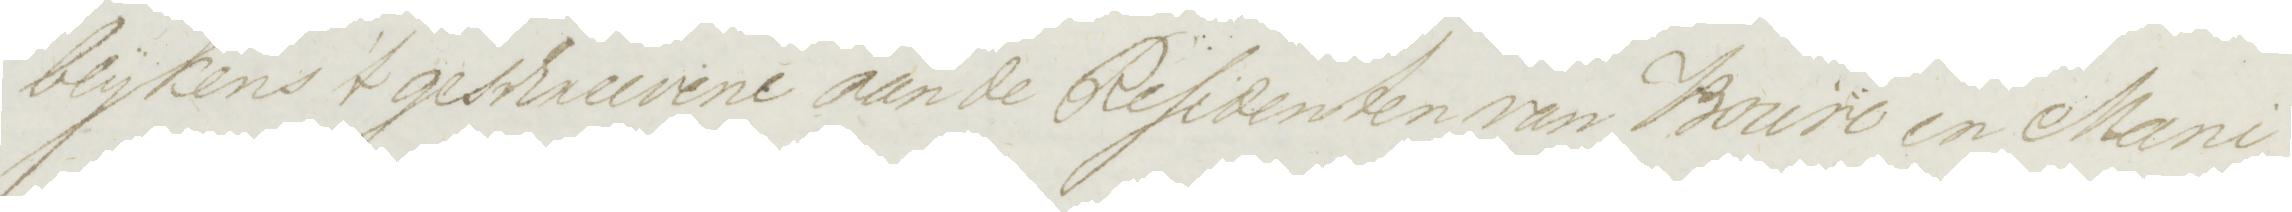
blijkens ’t geschreevene aan de Residenten van Bouro en Mani
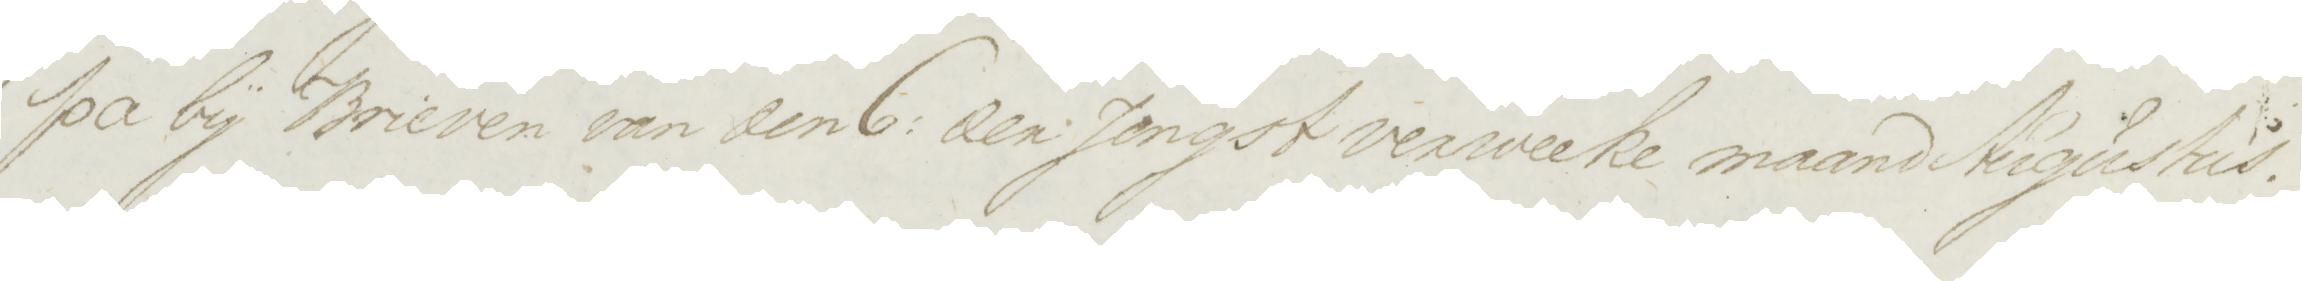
pa bij Brieven van den 6: den Jongst verweeke maand Augustus.
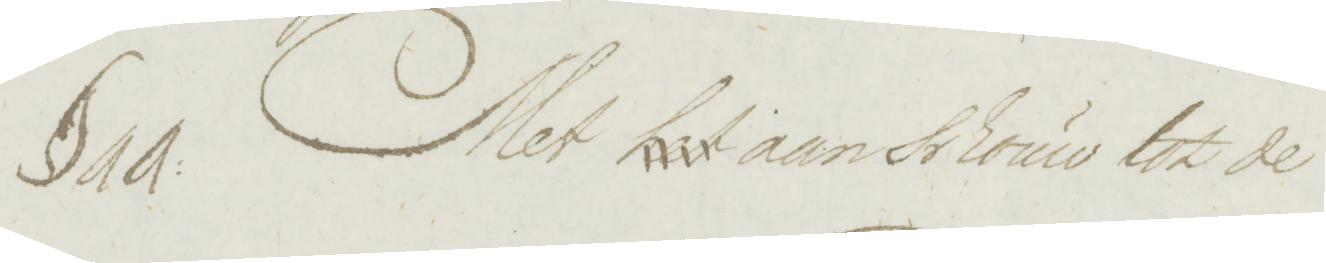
§ 44: Met het aan schouw tot de
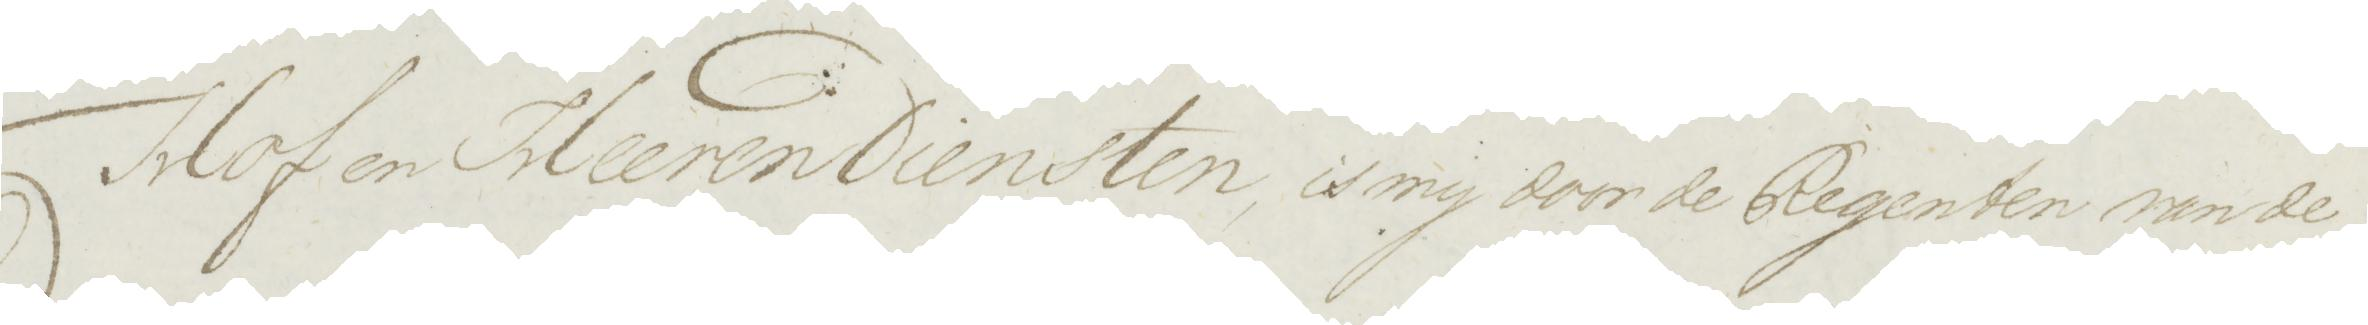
Hof en Heeren diensten, is my door de Regenten van de
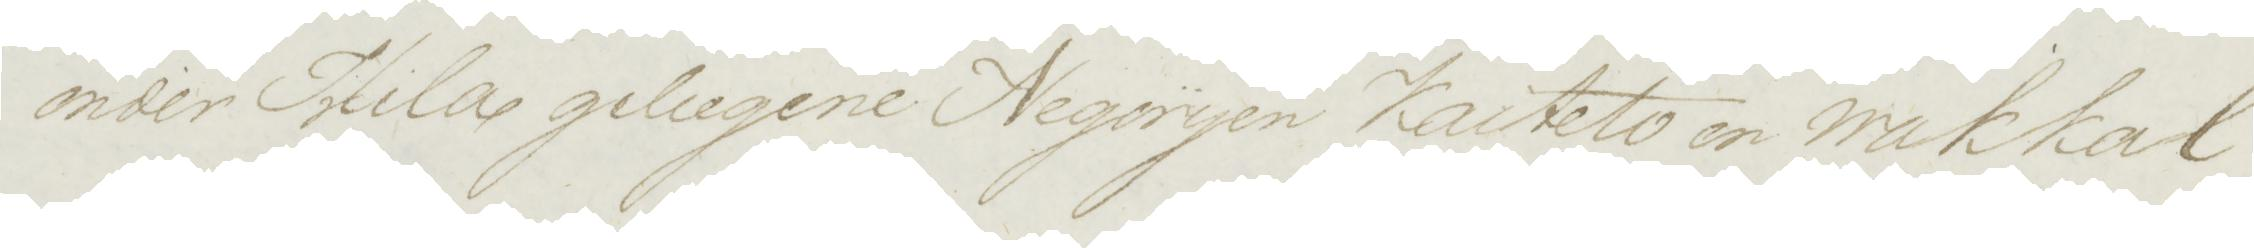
onder Hila geleegene Negorijen Kaiteto en wakkal
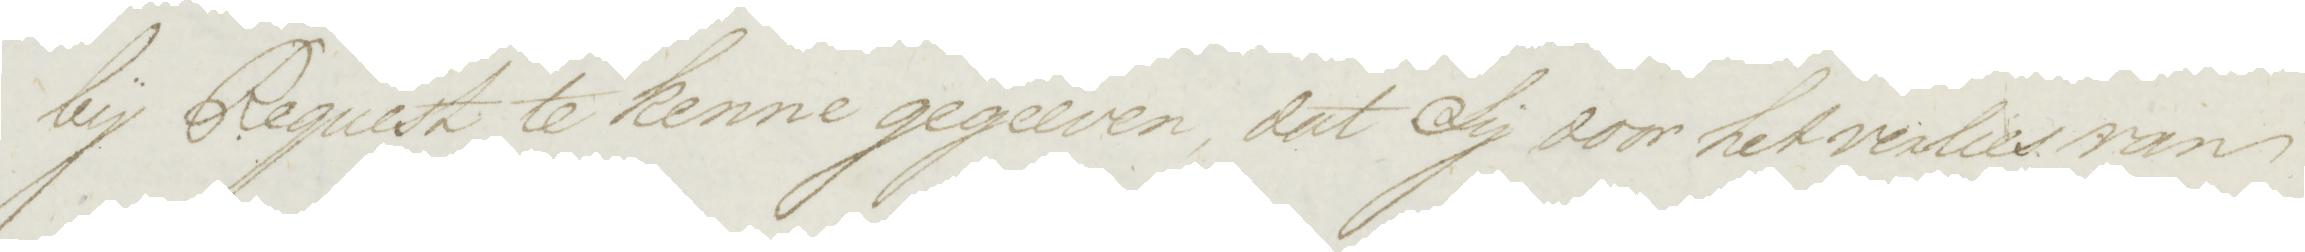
bij Request te kenne gegeeven, dat sij door het verlies van
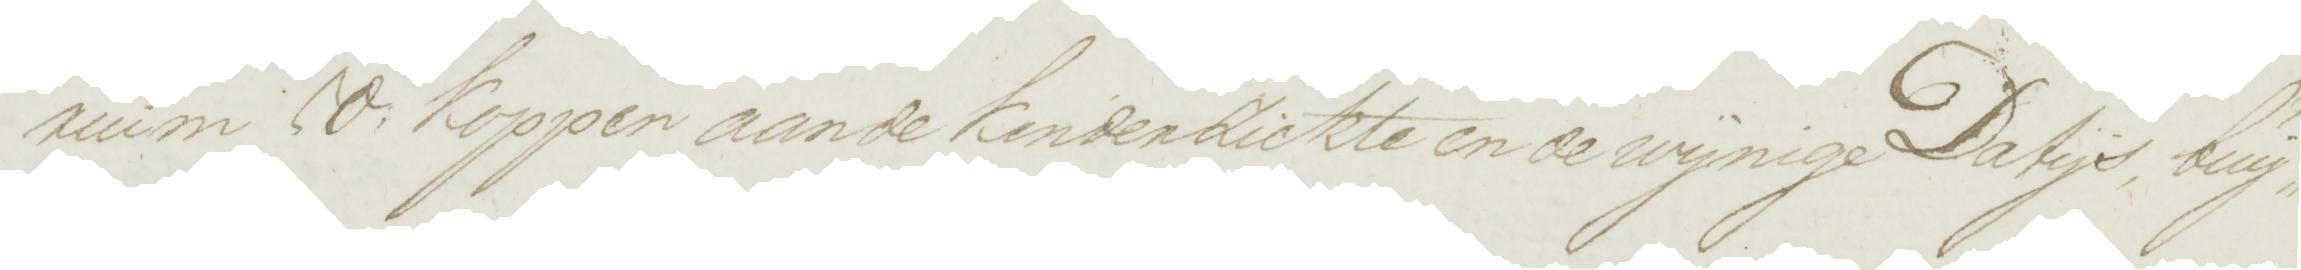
ruim 50: koppen aande kinderziekte en de wijnige Datijs, buij
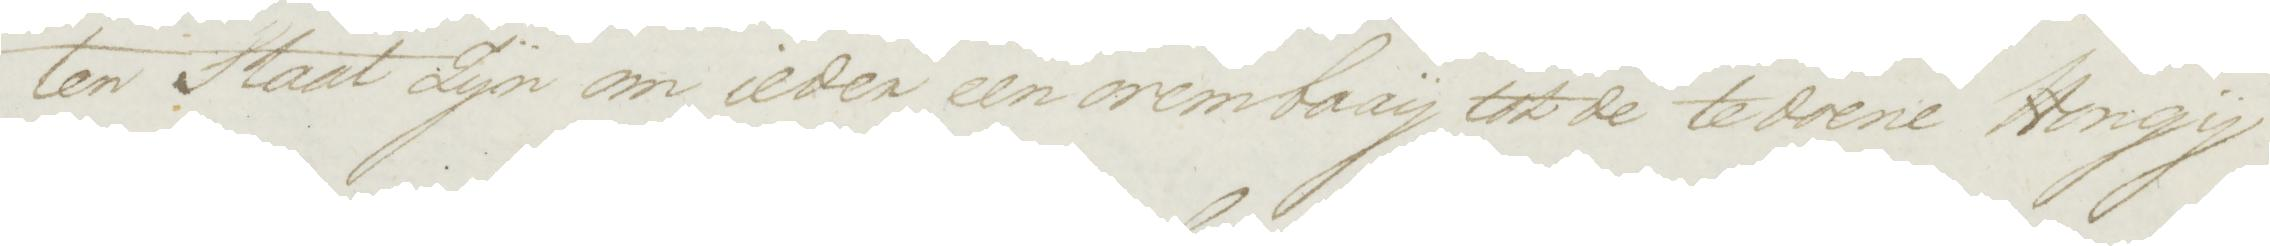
ten staat zijn om ieder een orembaaij tot de te doene Hongij
